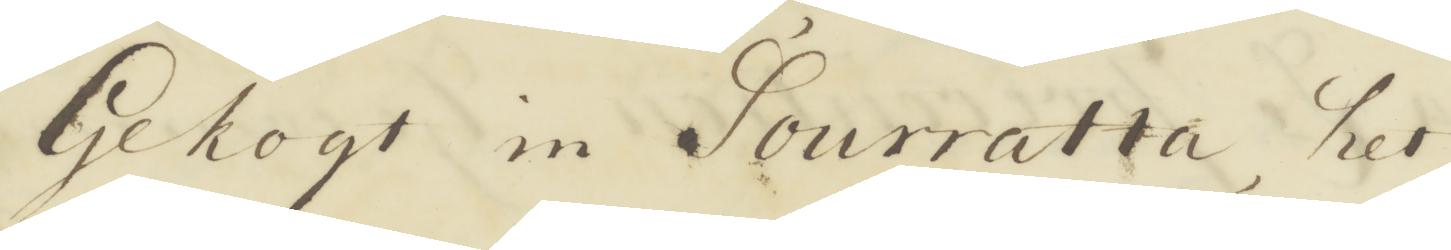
Gekogt in Sourratta, het
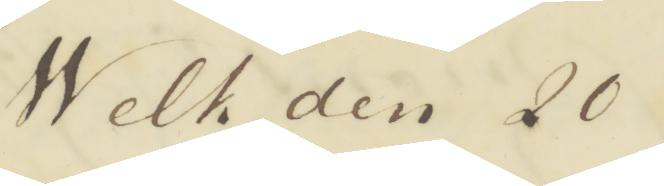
Welk den 20:' off 25 dezer
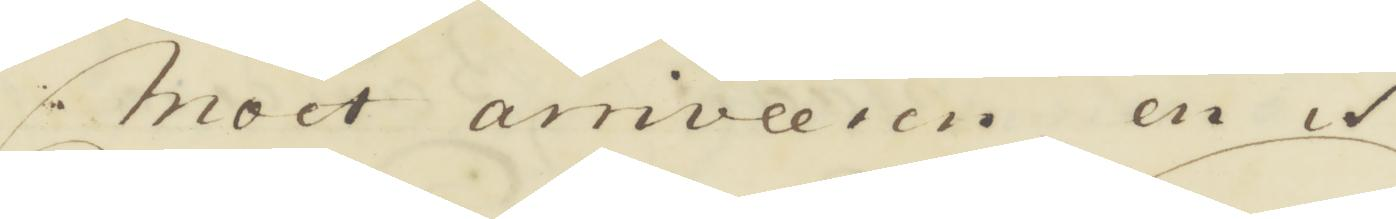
moet arriveeren en is
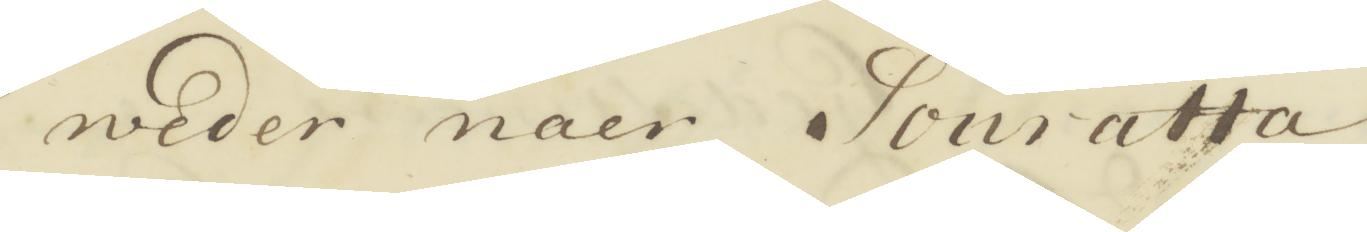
weder naer Souratta
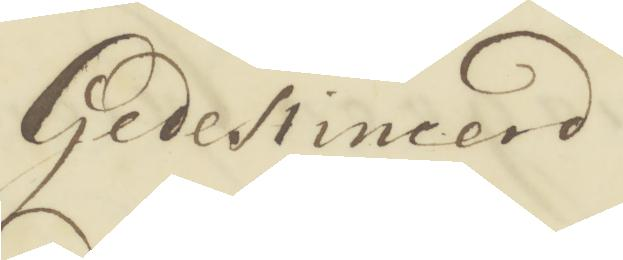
Gedestineerd
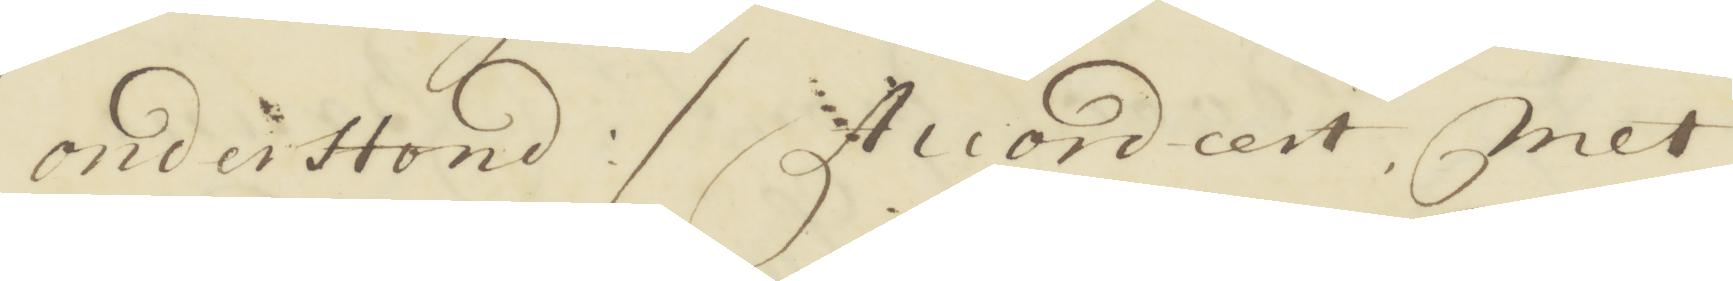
/: onderstond :/ Accordeert, met
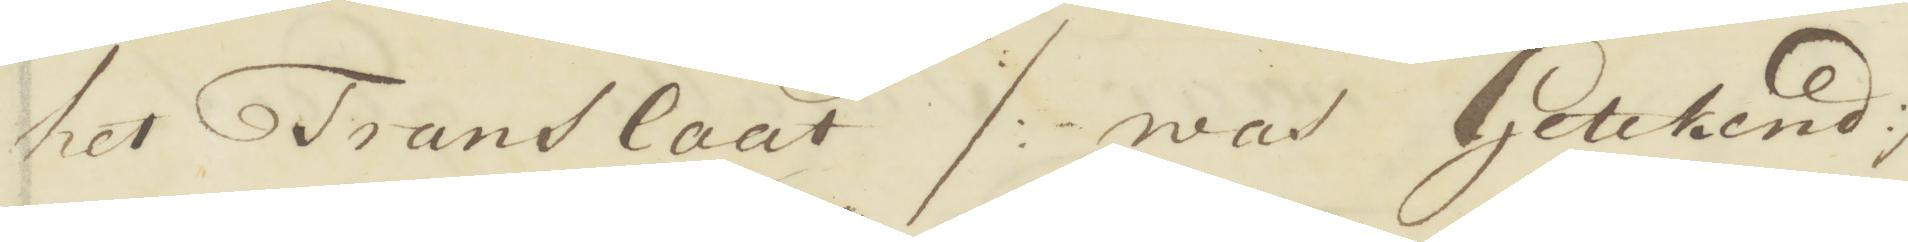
het Translaat /: was Getekend :/
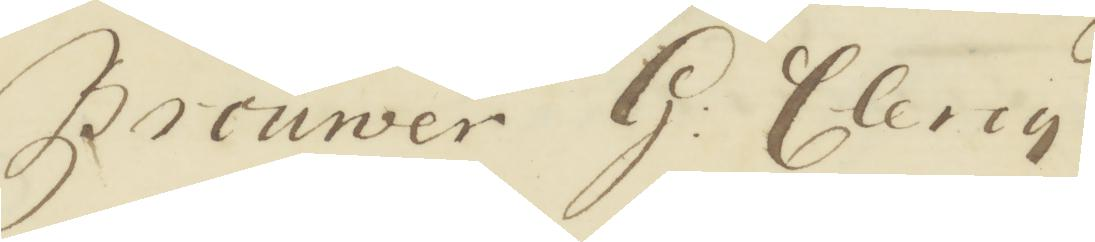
F:s Brouwer G: Clercq
